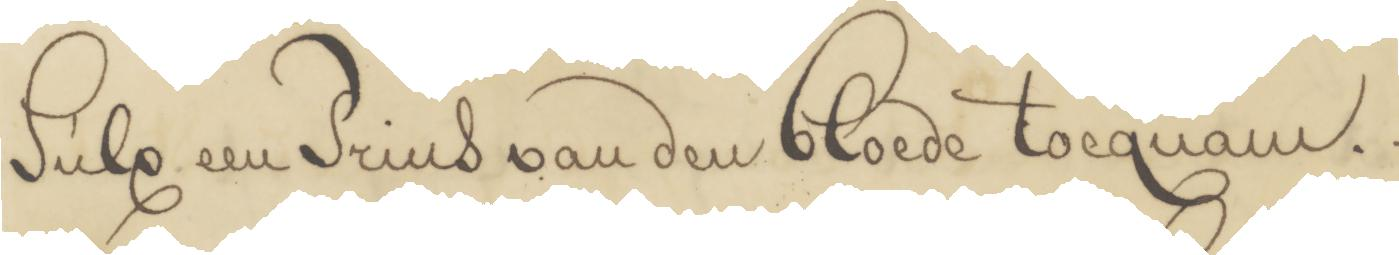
sulx een Prins van den bloede toequam.
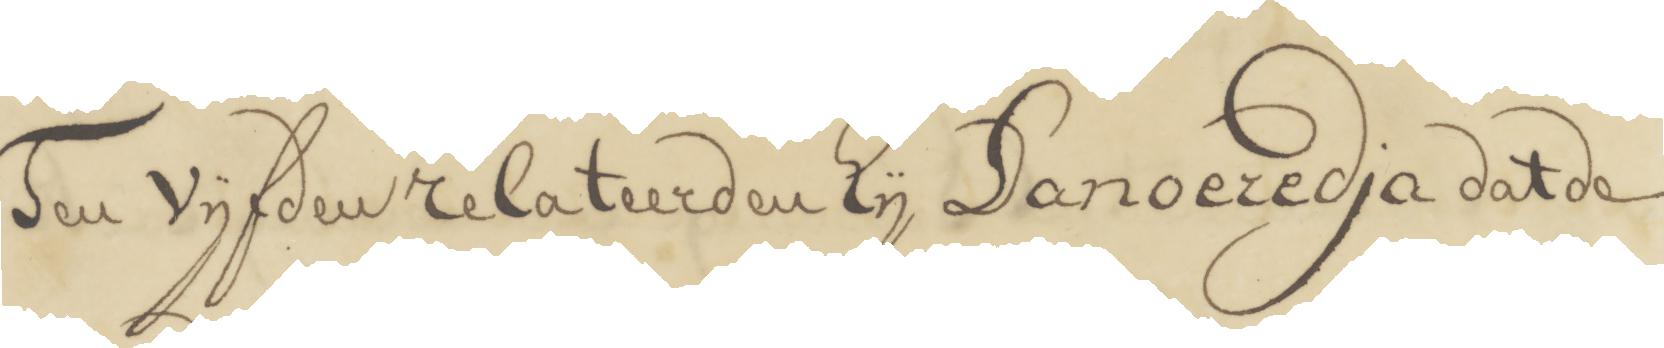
Ten vijfden relateerden hij Danoeredja dat de
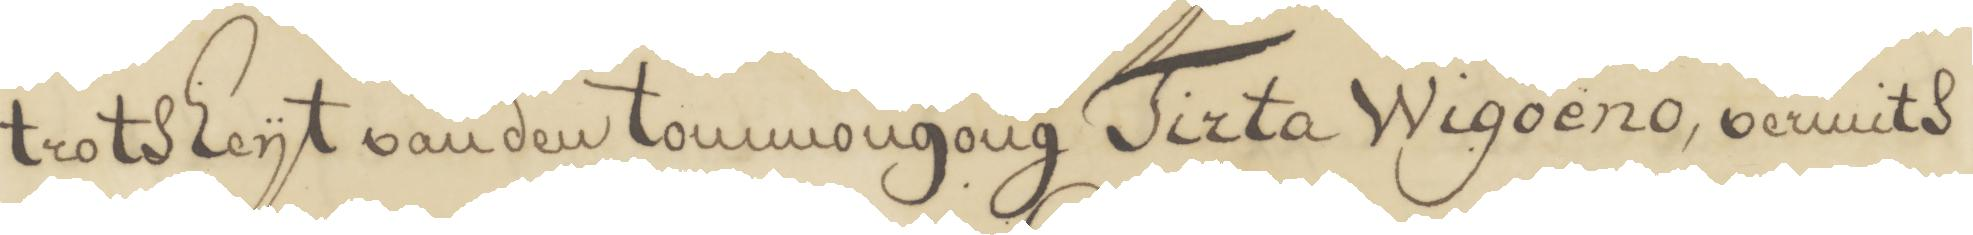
trotsheijt van den tommongong Tirta Wigoeno, vermits
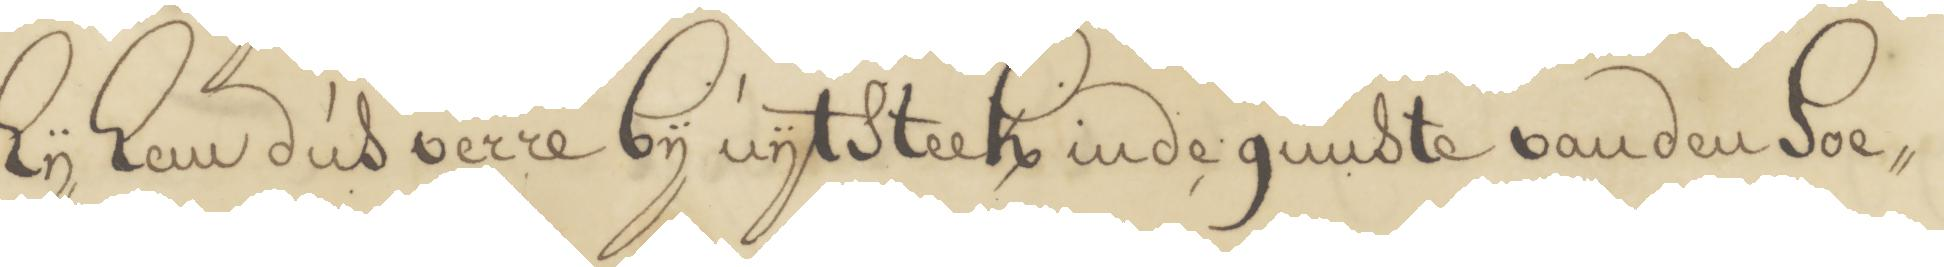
hij hem dus verre bij uijtsteek in de gunste van den soe„
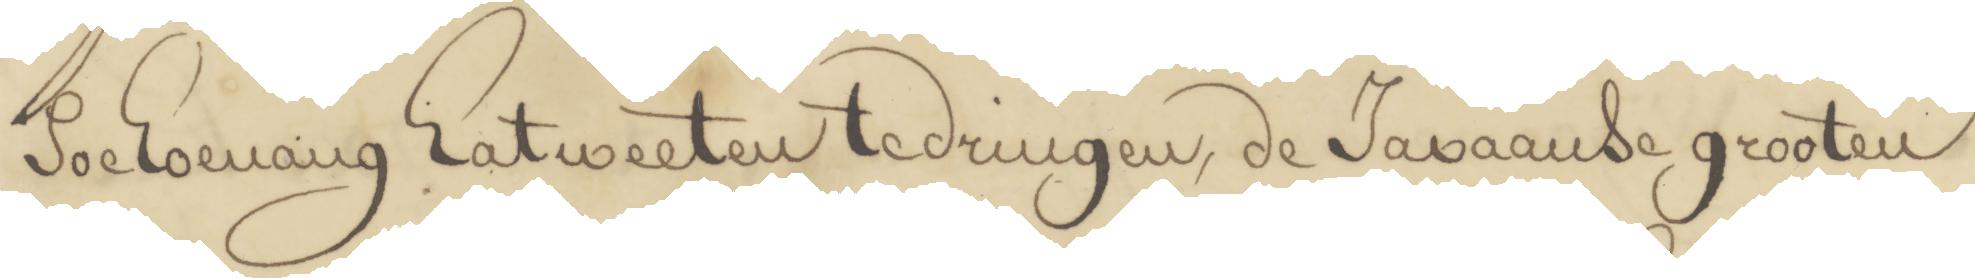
soehoenang hat weeten te dringen, de Iavaanse grooten
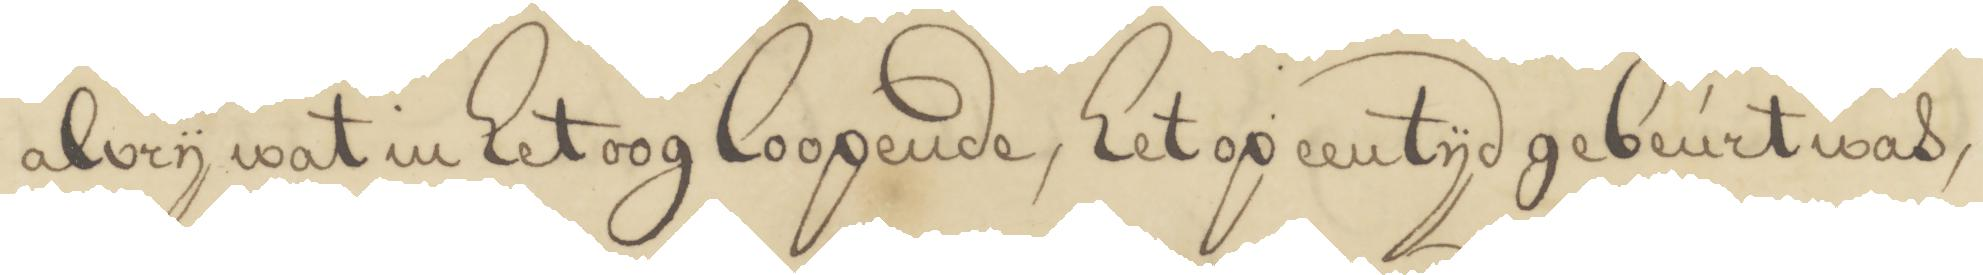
al vrij wat in het oog loopende, het op een tijd gebeurt was,
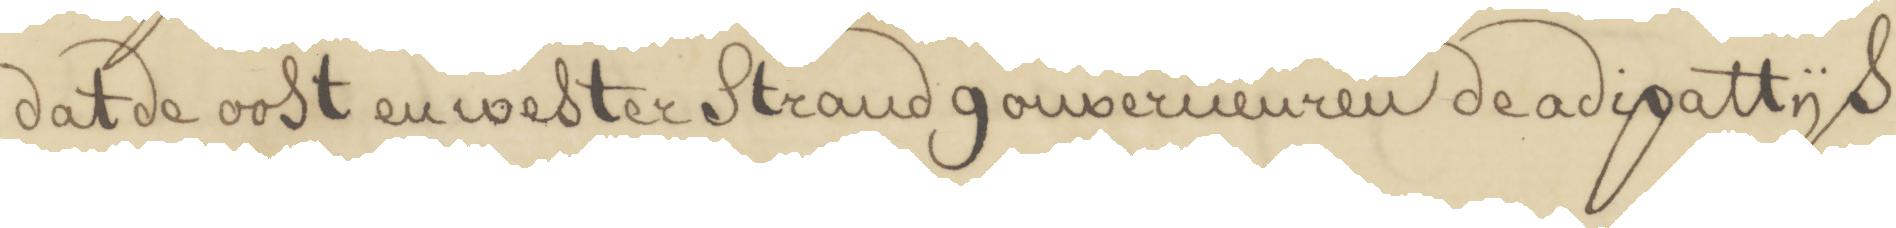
dat de oost en wester strand gouverneuren de adipattijs
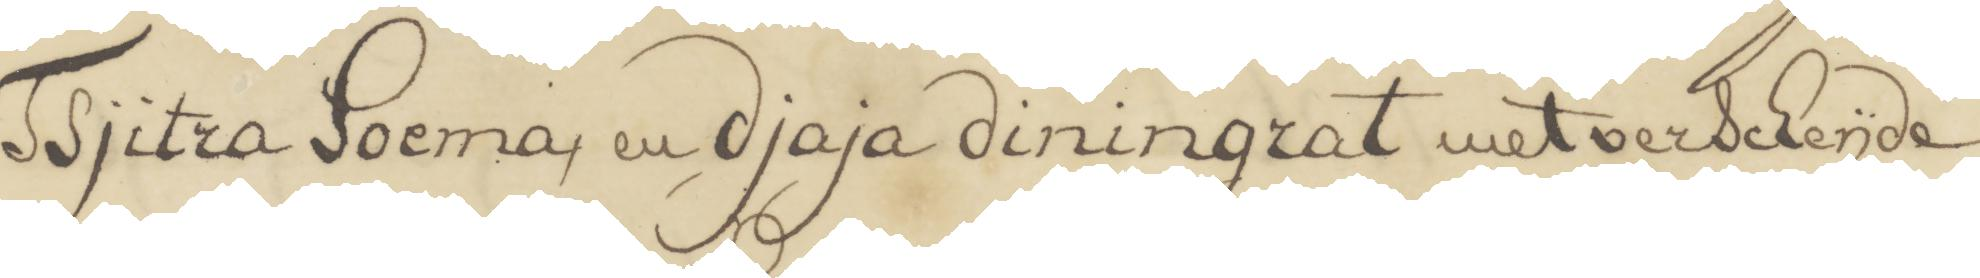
Tsjitra Soema, en djaja diningrat met verscheijde
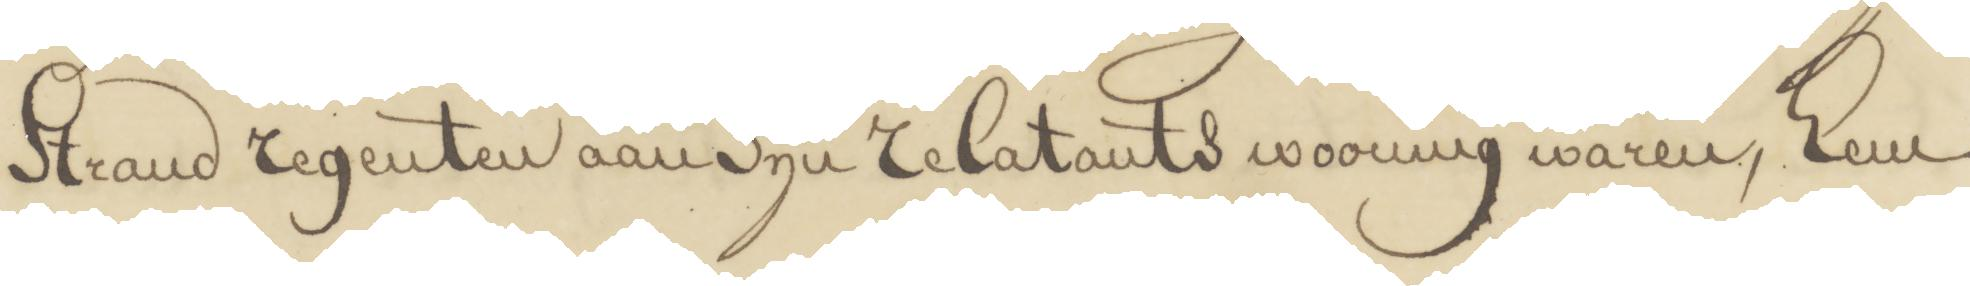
strand regenten aan sijn relatants wooning waren, hem
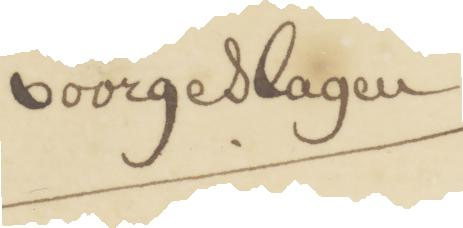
voorgeslagen
